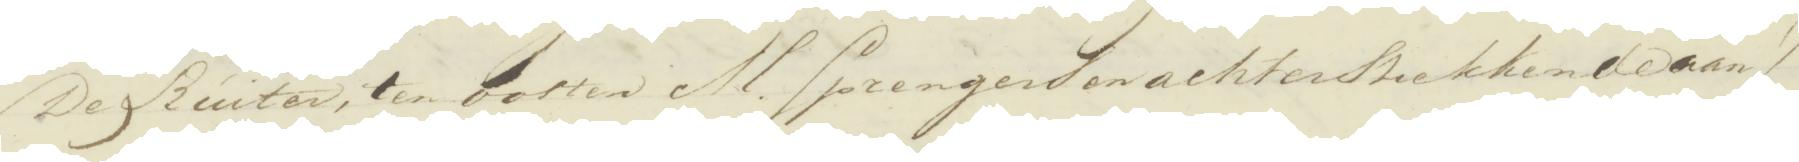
De Ruiter, ten oosten M. Sprengers en achter strekkende aan J.
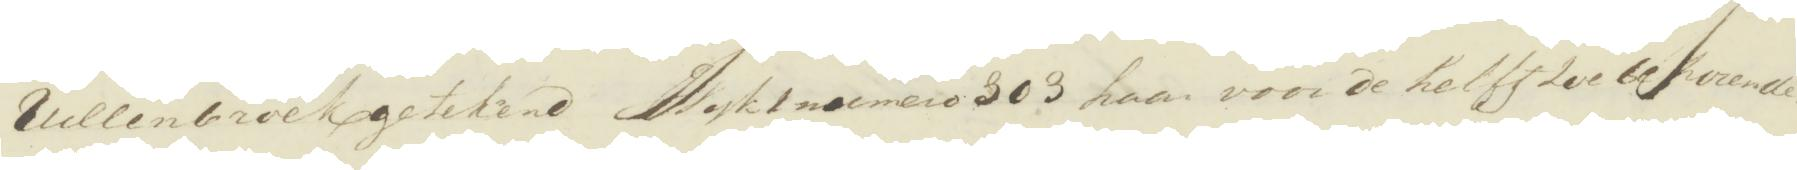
Uillenbroek getekend Wyk 1 numero 303 haar voor de helff toe behorende
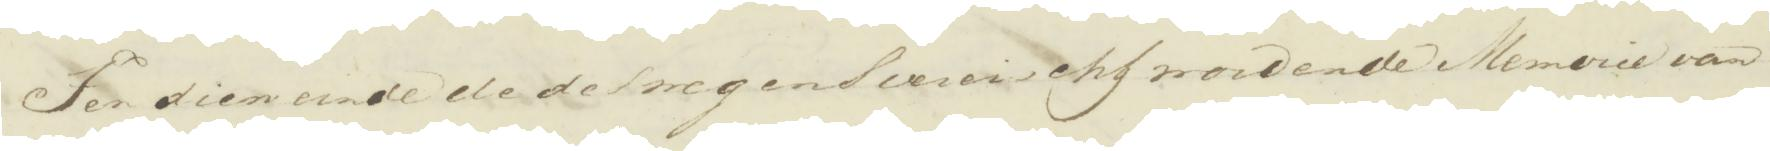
Ten dien einde de deswegens vereischt wordende Memorie van
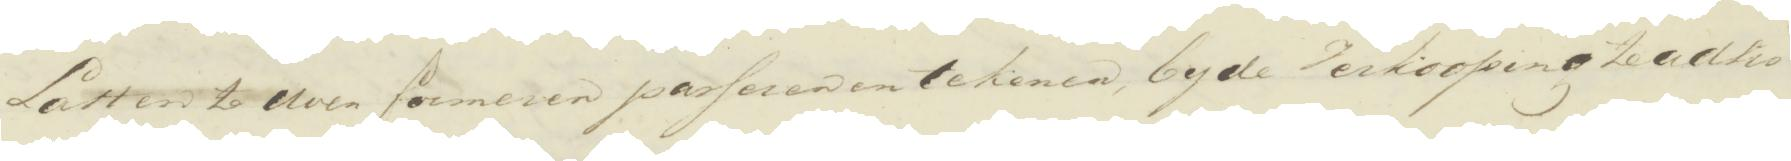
Lasten te doen formeren passeren en tekenen, by de Verkooping te adsis
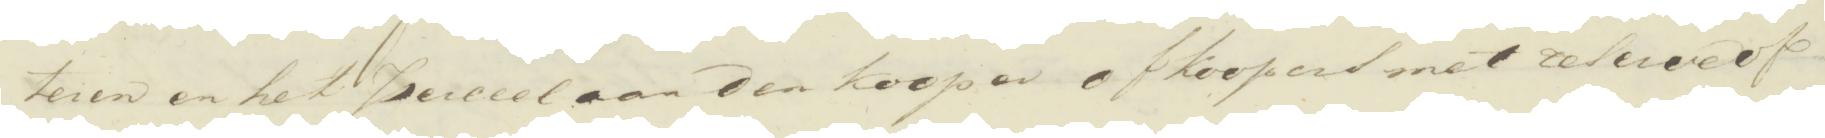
teren en het Perceel aan den kooper of koopers met reserve of
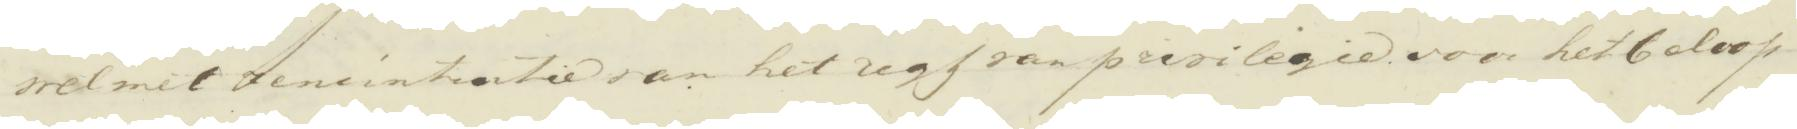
wel met renuntiatie van het regt van privilegie voor het beloop
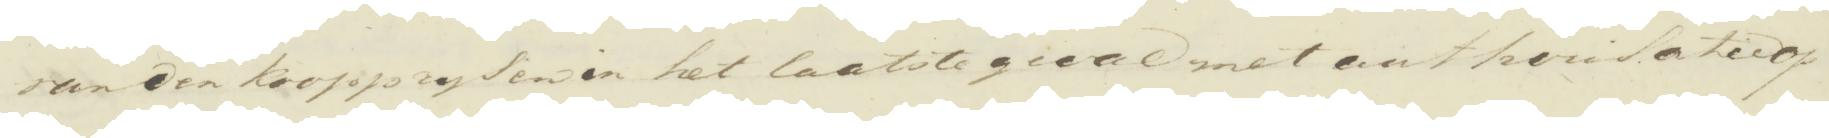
van den koopprys en in het laatste geval met authorisatie op
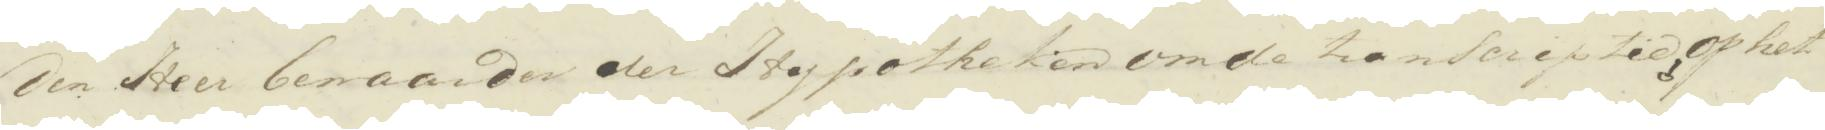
den Heer bewaarder der Hypotheken om de transcriptie,^ op het
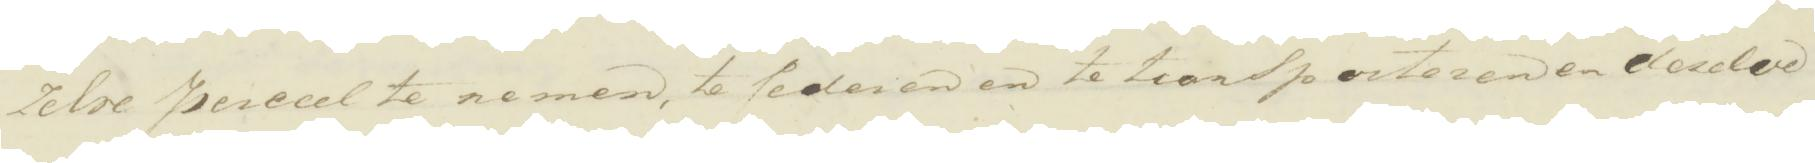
zelve perceel te nemen, te Cederen en te transporteren en dezelve
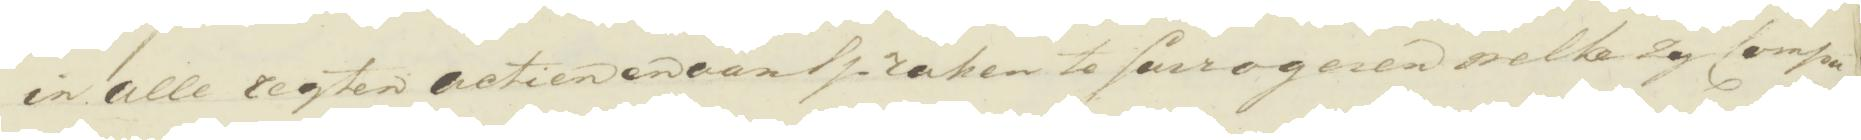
in alle regten actien en aanspraken te Surrogeren welke zy Compa
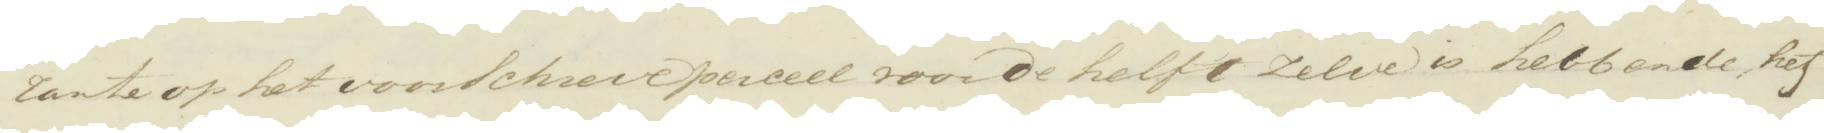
rante op het voorschreve perceel voor de helft zelve is hebbende, het
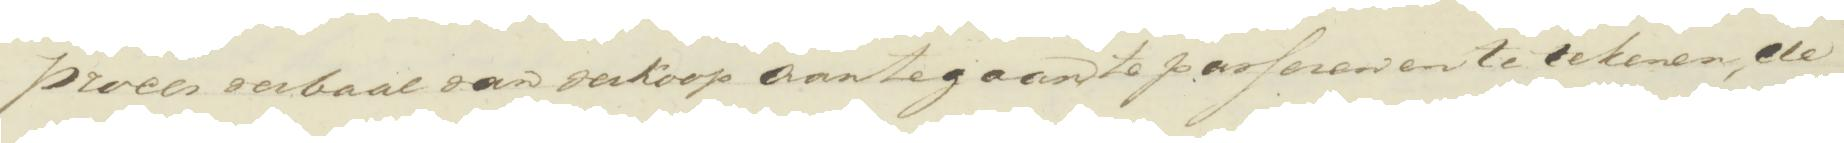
procesverbaal van verkoop aan te gaan, te passeren en te tekenen, de
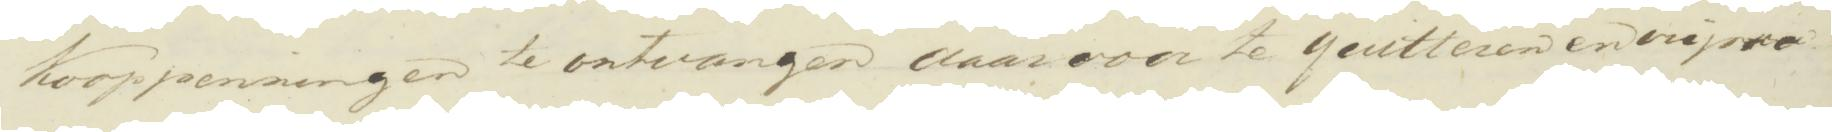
kooppenningen te ontvangen daarvoor te quitteren en vrijwa
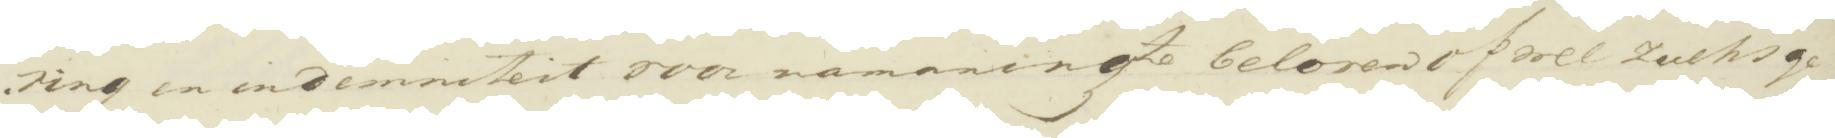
„ring en indemniteit voor namaning te beloven of wel zulks ge
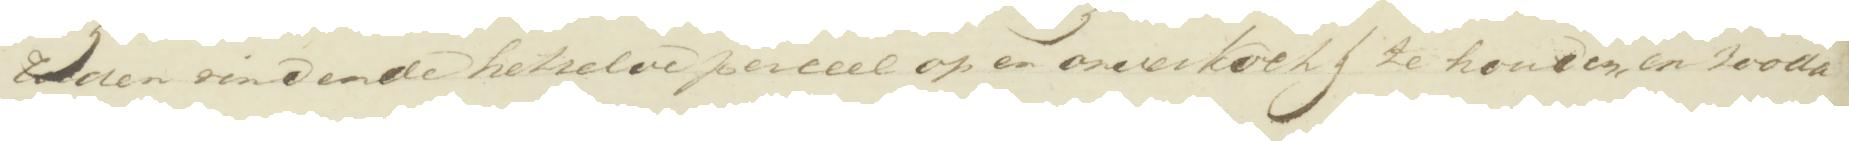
raden vindende hetzelve perceel op en onverkocht, te houden en zooda
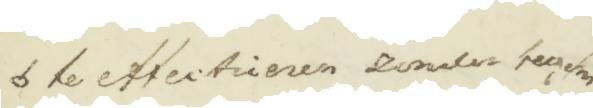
^ te effectueren zonder tegen
